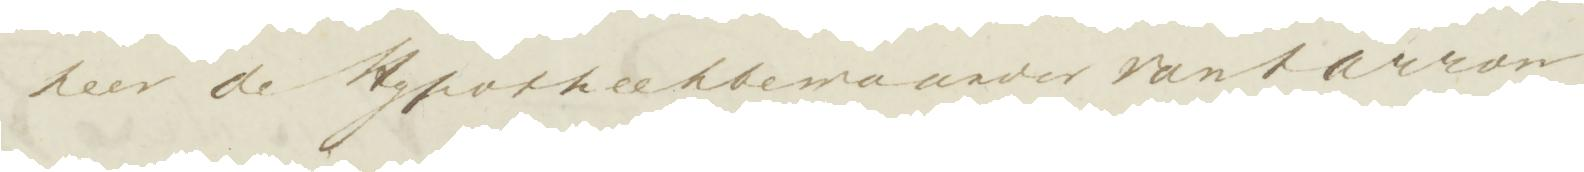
heer de Hypotheekbewaarder van t arron
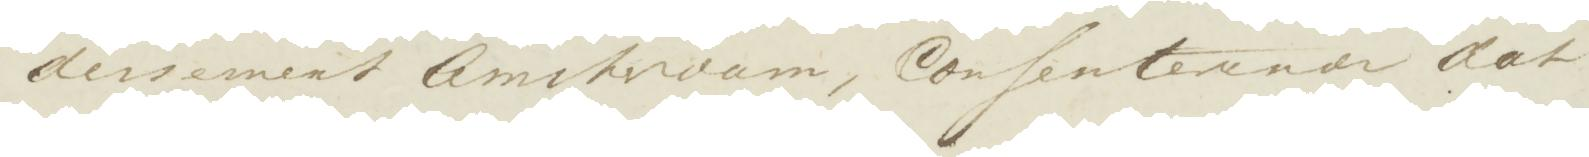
dissement Amsterdam, Consenterende dat
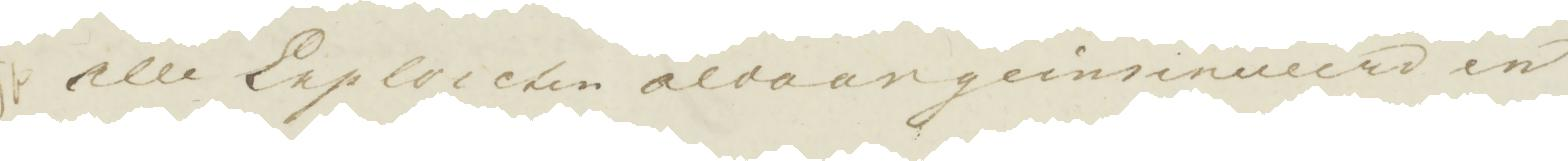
alle Exploiten aldaar geinsinueerd en
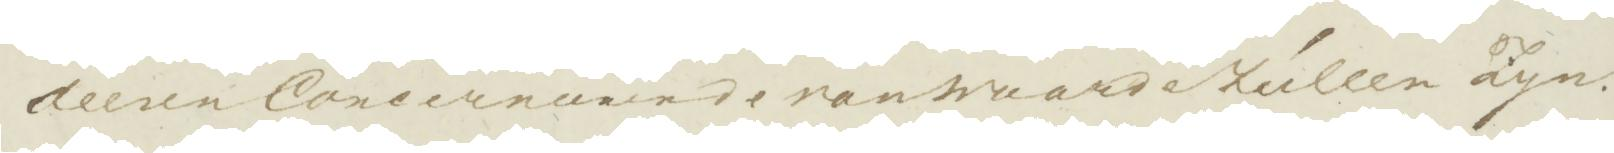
deesen Concerneerende van waarde zullen zyn.
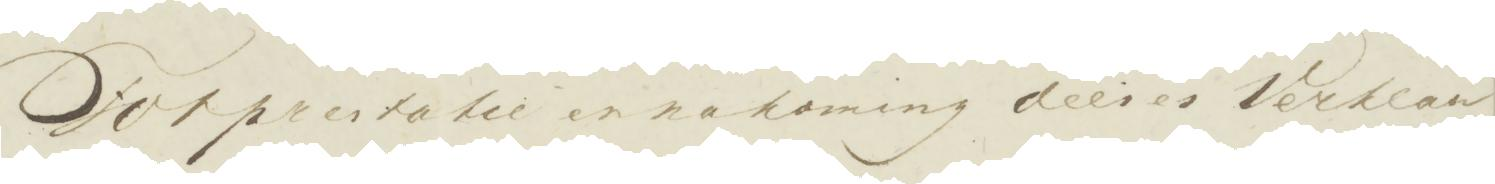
Tot prestatie en nakoming deeses Verklaar
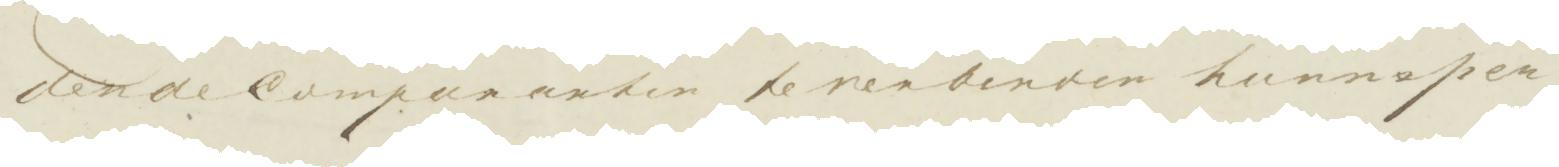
den de Comparanten te verbinden hunne per
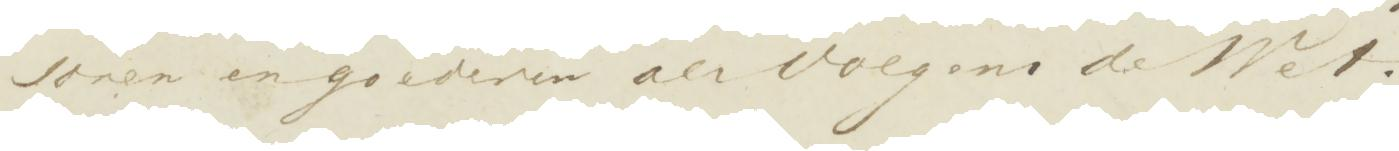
sonen en goederen als volgens de Wet.
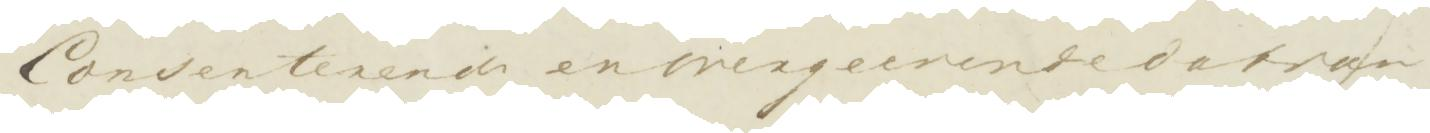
Consenterende en overgeevende dat van
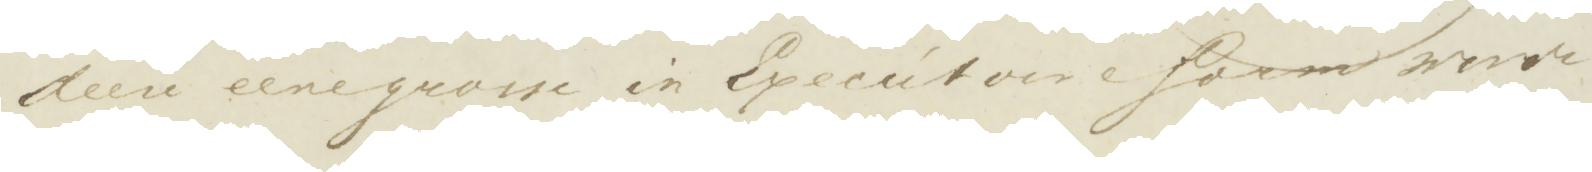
deese eene grosse in Executoire form worde
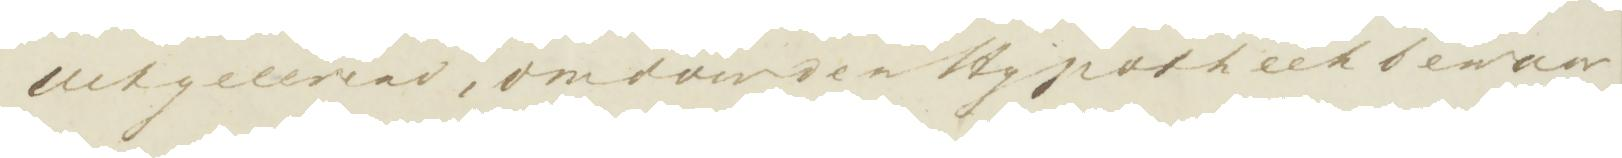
uitgeleverd, om door den Hypotheek bewaar
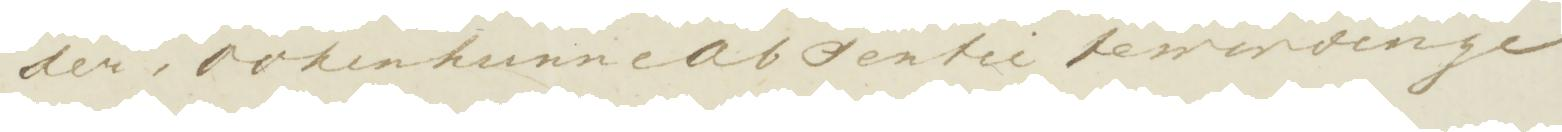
der, ook in hunne absentie te worden ge
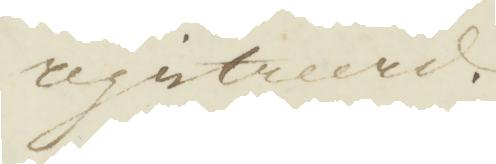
registreerd.
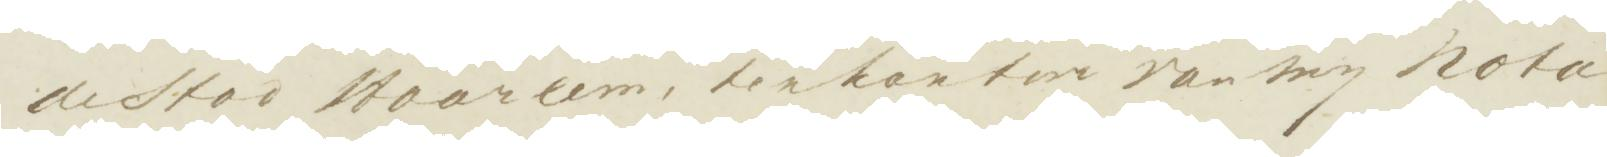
de stad Haarlem, ten kantore van my Nota
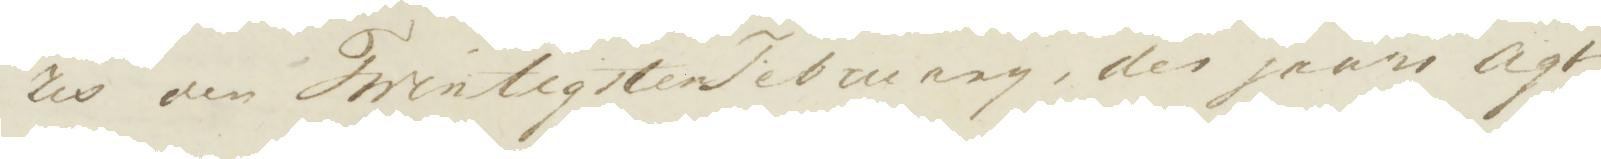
ris den Twintigsten February, des jaars Agt
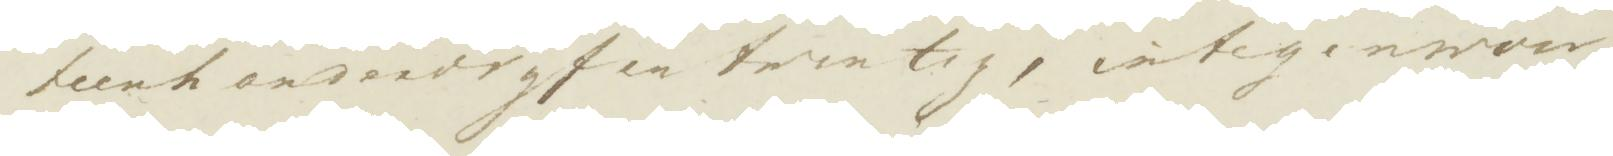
tienhonderd vyf en twintig, integenwoor
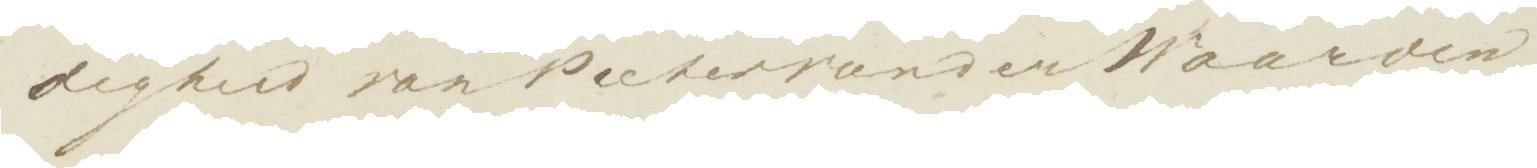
digheid van Pieter van der Waarden
